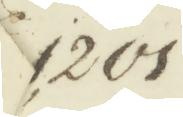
1201
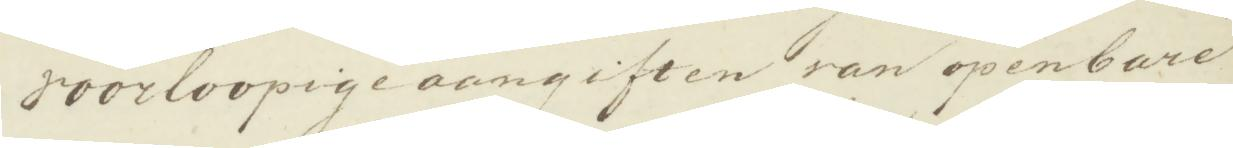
voorloopige aangiften van openbare
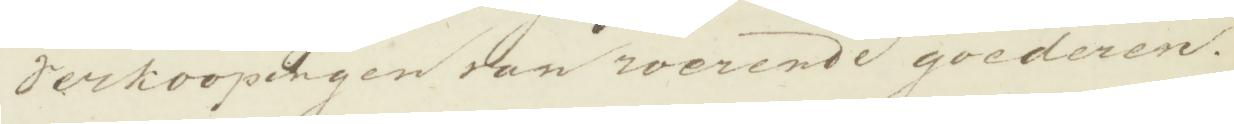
verkoopingen van roerende goederen.
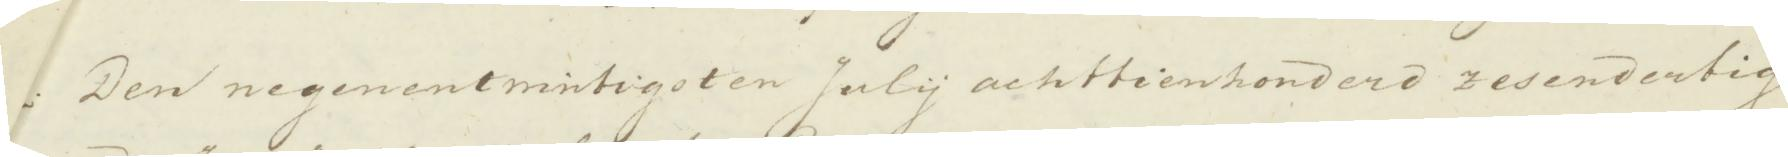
Den negenentwintigsten Julij achttienhonderd zesendertig
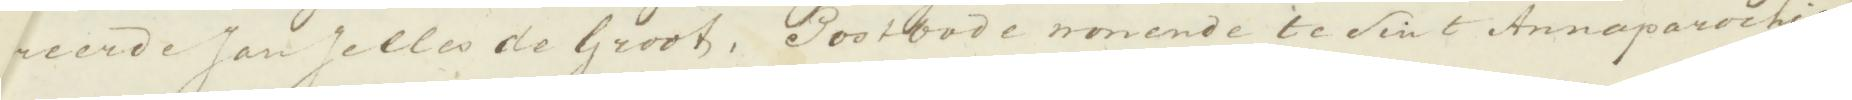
reerde Jan Jelles de Groot, Postbode wonende te Sint Annaparochie
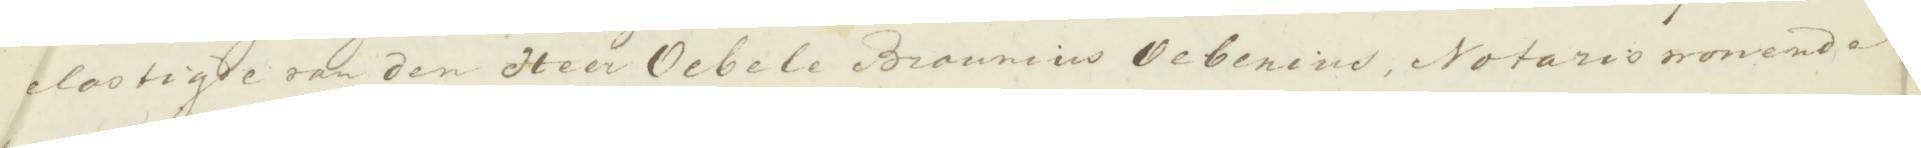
elastigde van den Heer Oebele Braunius Oeberius, Notaris wonende
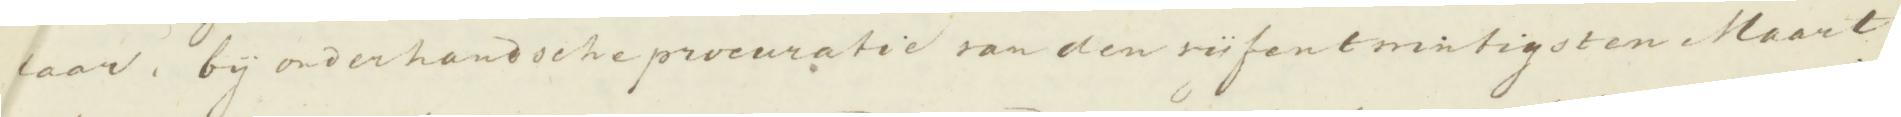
aar, bij onderhandsche procuratie van den vijfentwintigsten Maart
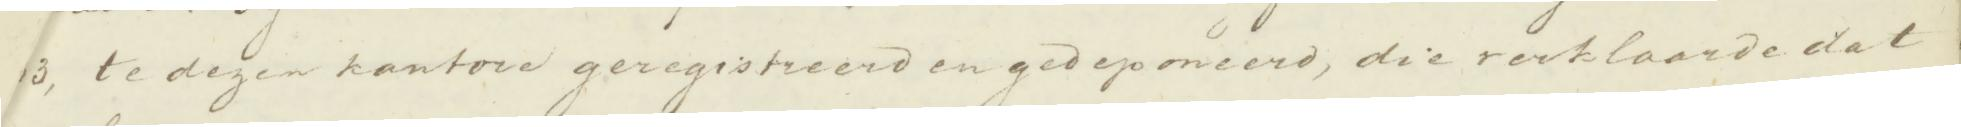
3, te dezen kantore geregistreerd en gedeponeerd, die verklaarde dat
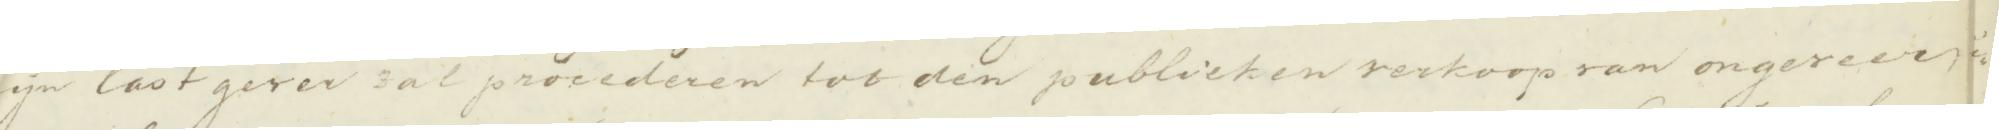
ijn last gever zal procederen tot den publieken verkoop van ongeveer
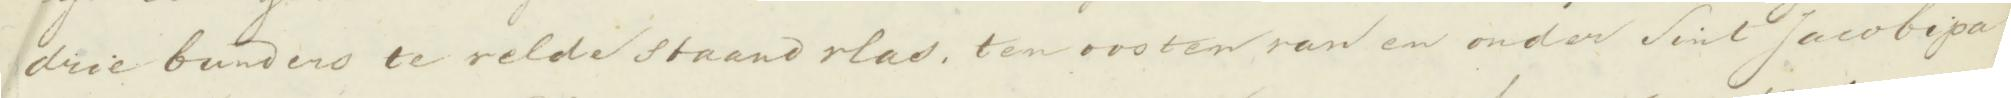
drie bunders te velde staand vlas, ten oosten van en onder sint Jacobipa
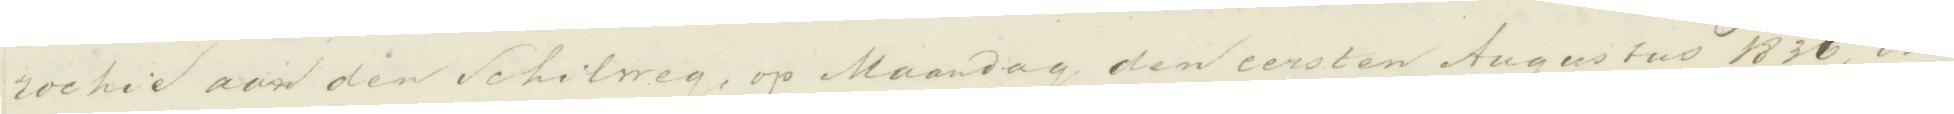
rochie aan den Schilweg, op Maandag den eersten Augustus 1836, in
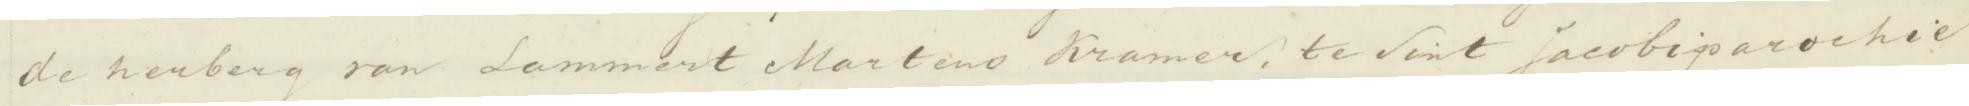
de herberg van Lammert Martens Kramer, te Sint Jacobiparochie
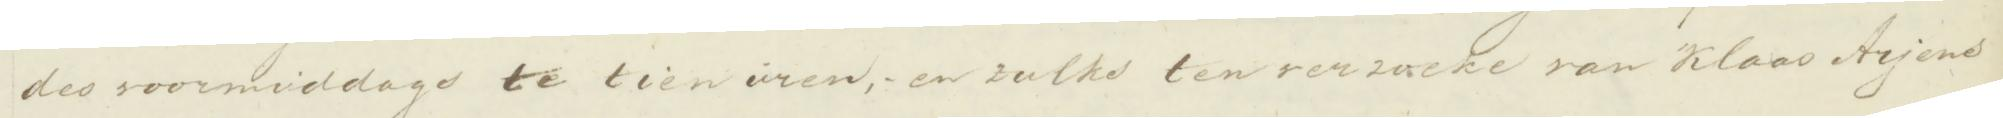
des voormiddags te tien uren, en zulks ten verzoeke van Klaas Arjens
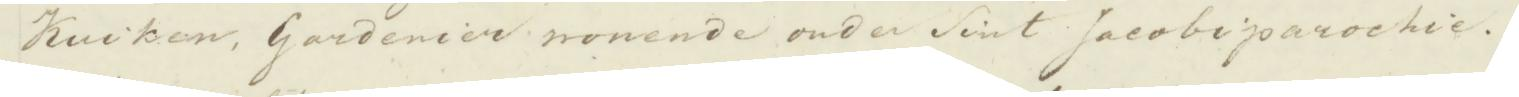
Kuiken, Gardenier wonende onder Sint Jacobiparochie.
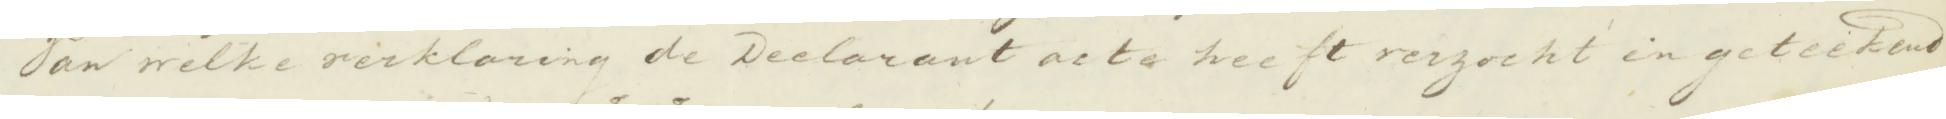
Van welke verklaring de Declarant acte heeft verzocht in geteekend
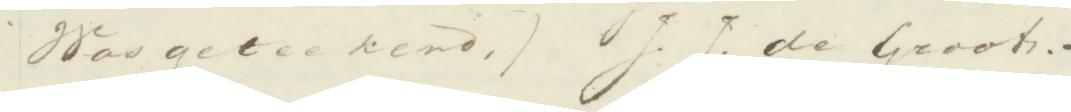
Was geteekend, ) J. J. de Groot.
